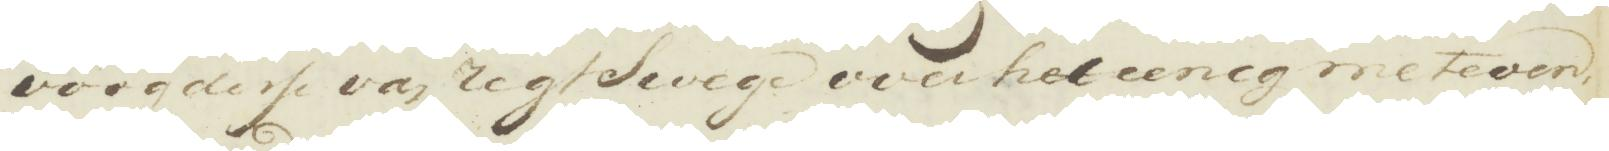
voogdesse van regtswege over het eenig meteven„
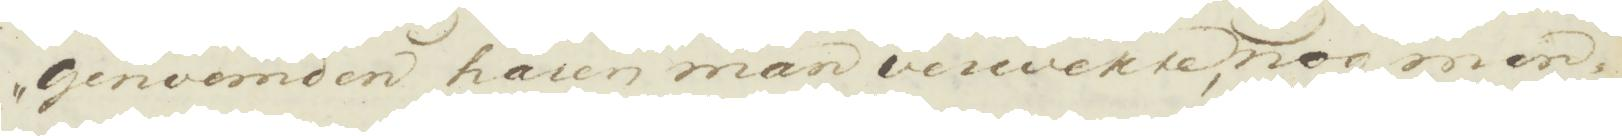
„genoemden haren man verwekte, nog min„
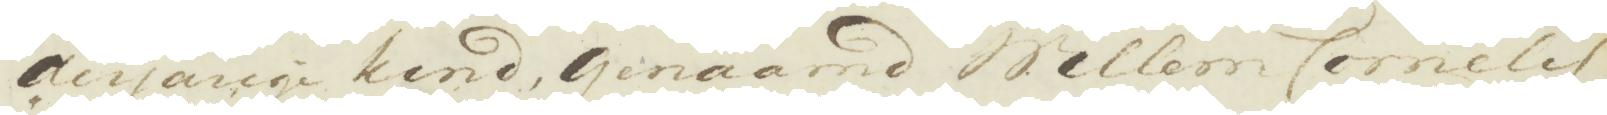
„derjarige kind, genaamd Willem Cornelis
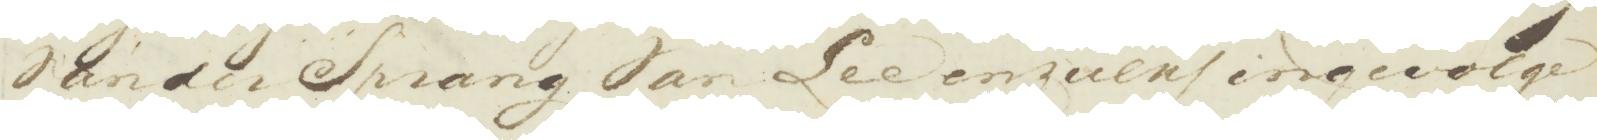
van der Sprang Van Lee en zulks ingevolge
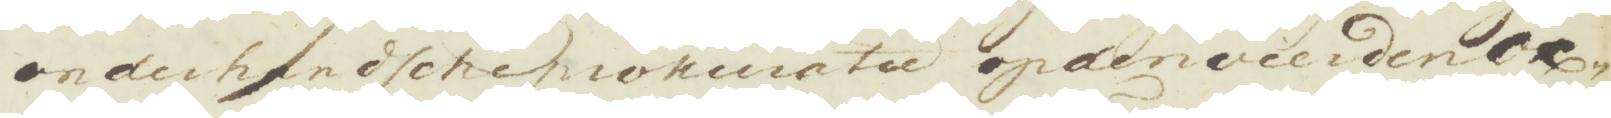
onderhandsche prokuratie op den vierden oc„
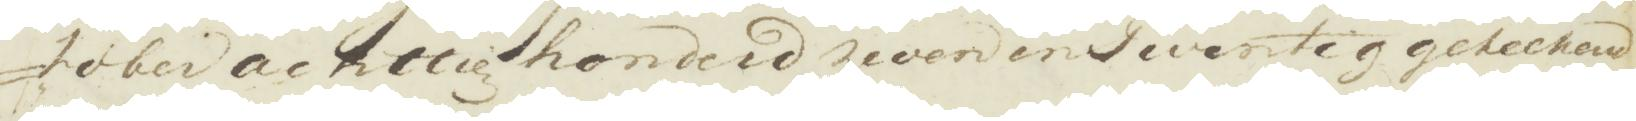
=tober achttienhonderd zeven en Twintig geteekend
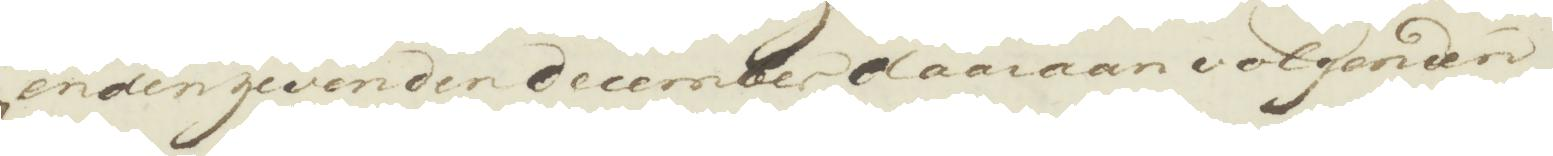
en den zevenden december daaraan volgenden
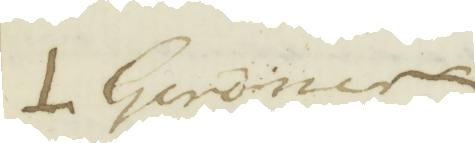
¶ Gerdner
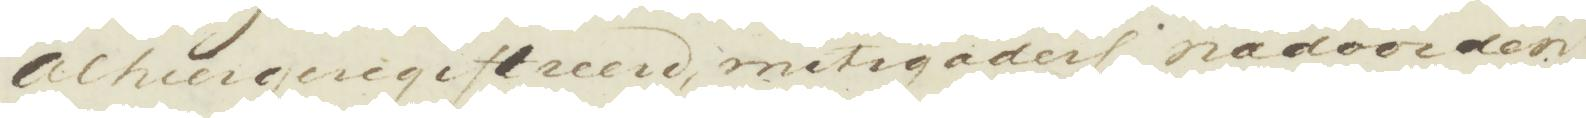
alhier geregistreerd, mitsgaders, na door den
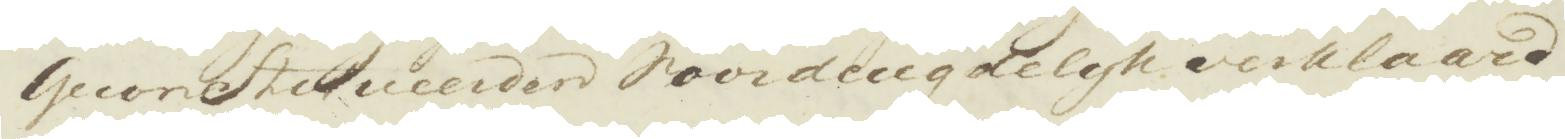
Geconstitueerden Voor deugdelyk verklaard
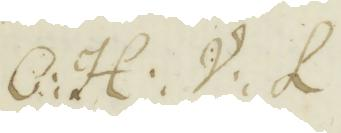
C:H: V: L
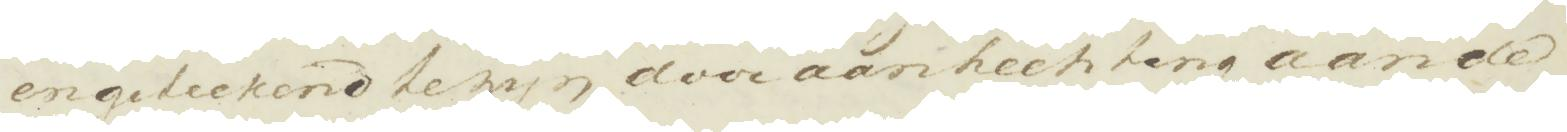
en geteekend te zijn, door aanhechting aan de
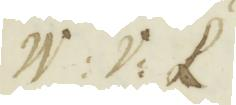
W:V: L
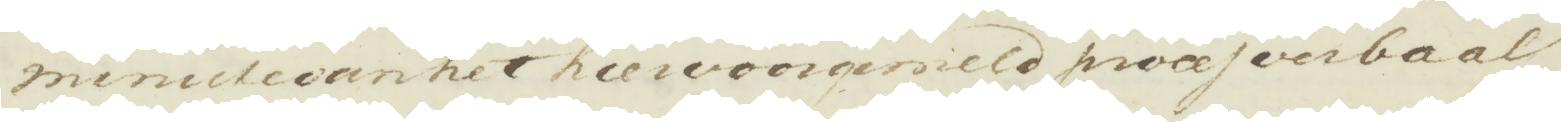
minute van het hier voorgemeld proces verbaal
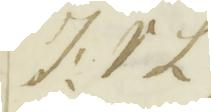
J: V L
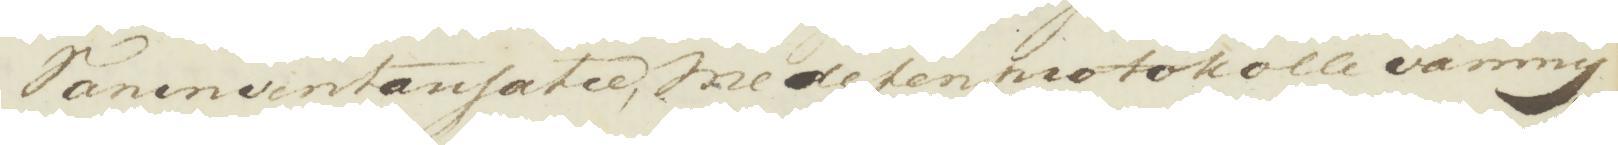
Vaninventarisatie, mede ten protokolle vanmy
